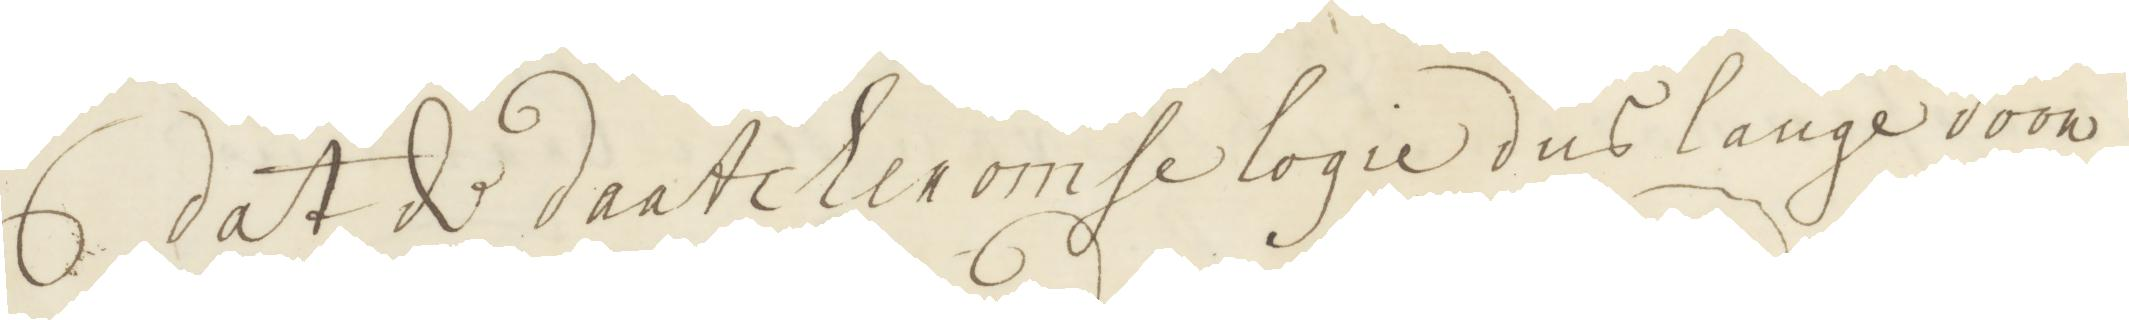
dat de daatcheromse logie dus lange door
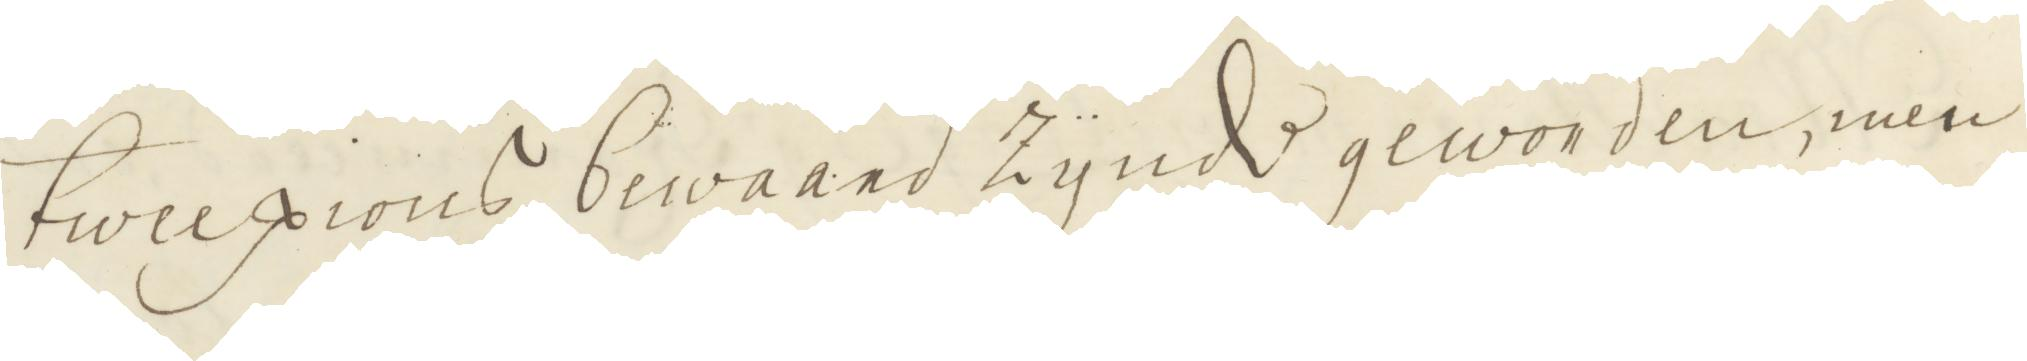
twee pions bewaard zijnde geworden, men
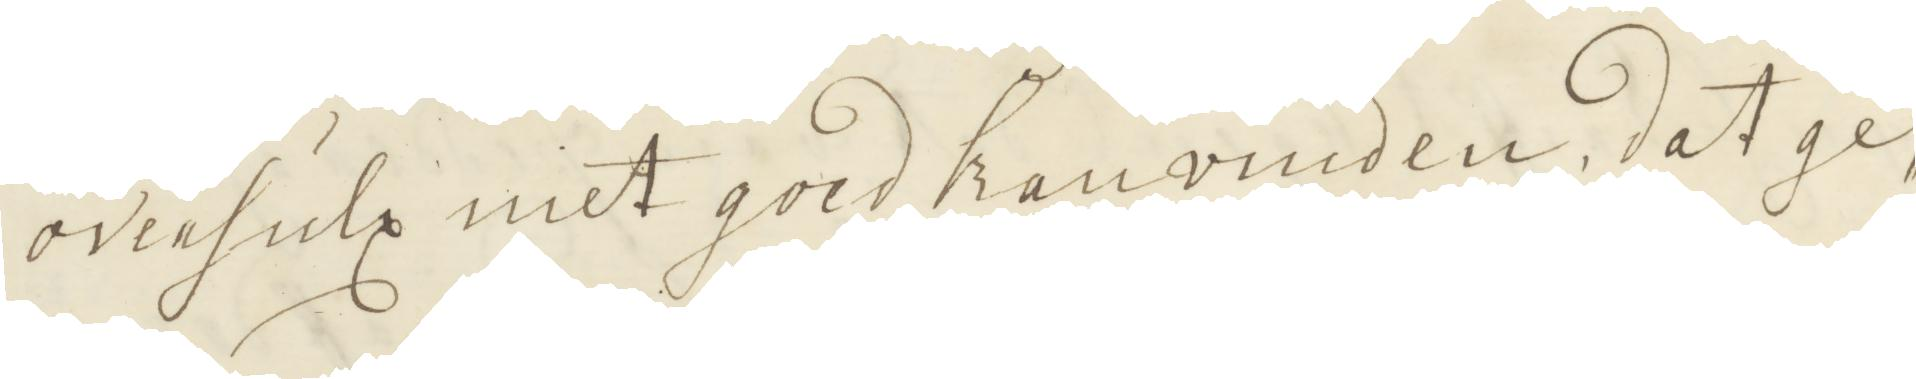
oversulx niet goed kan vinden, dat ge
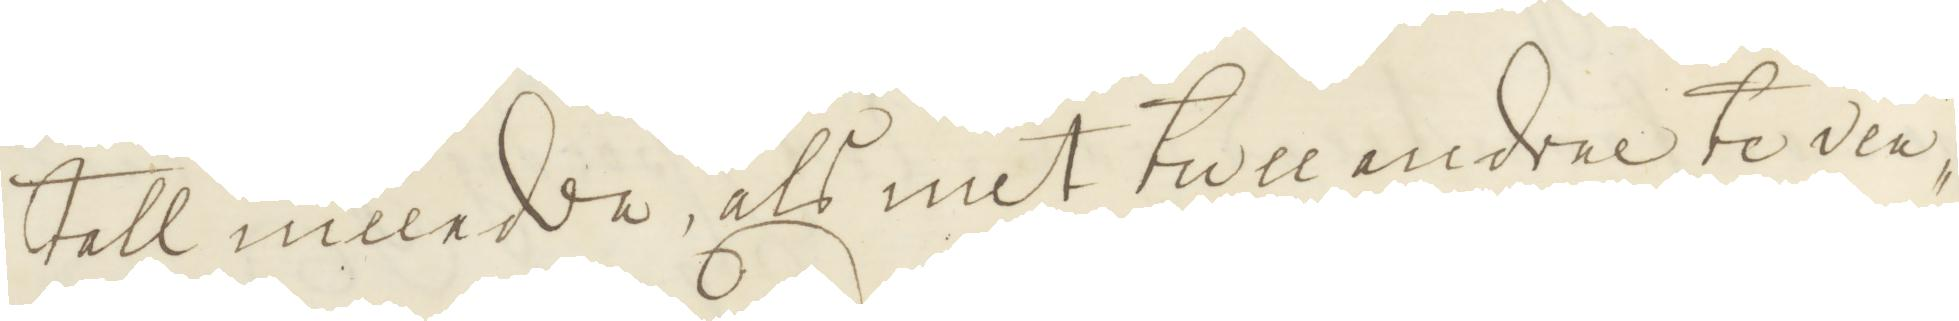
tall meerder, als met twee andere te ver„
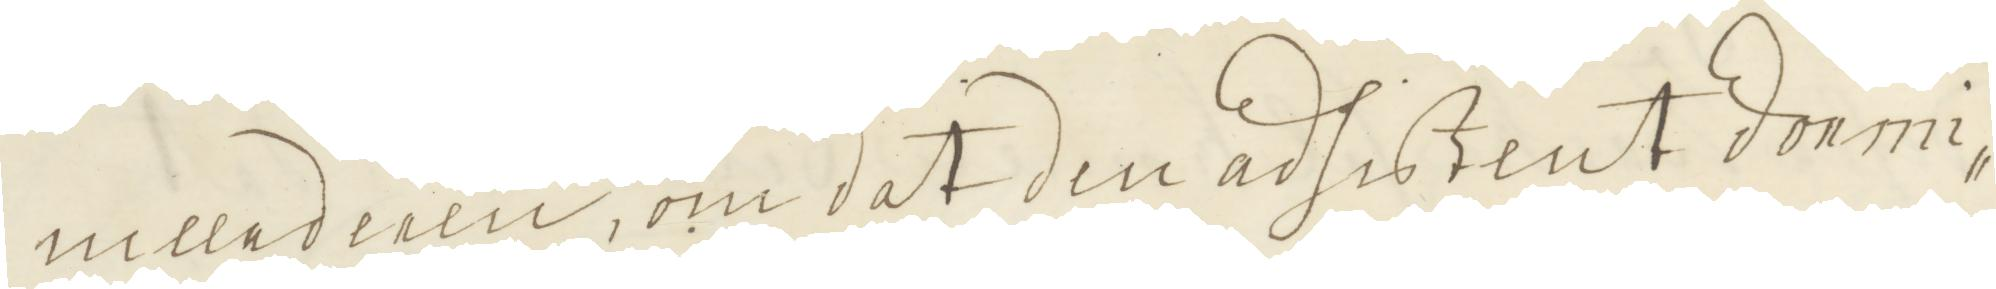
meerderen, om dat den adsistent dormi„
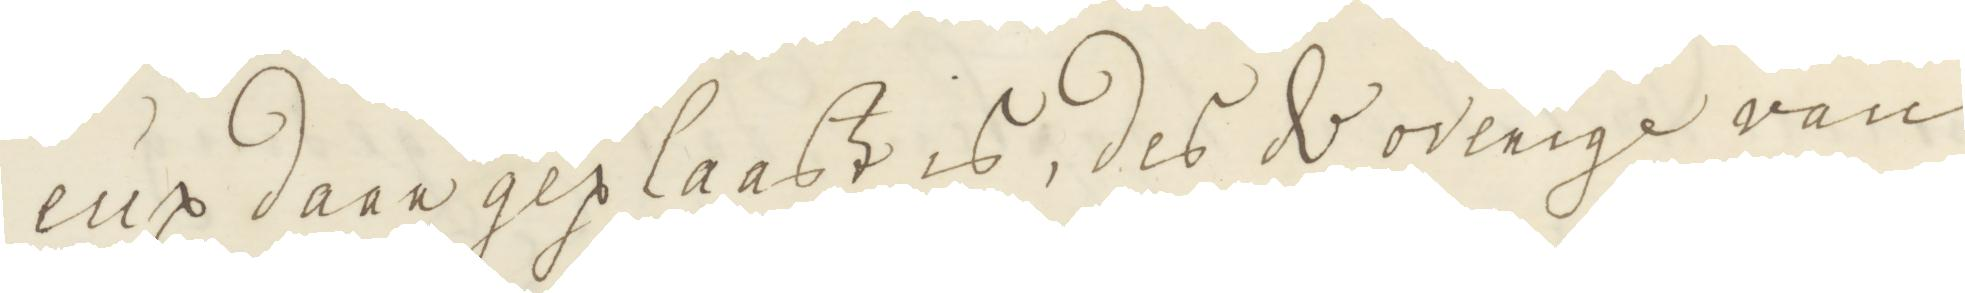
eux daar geplaast is, des de overige van
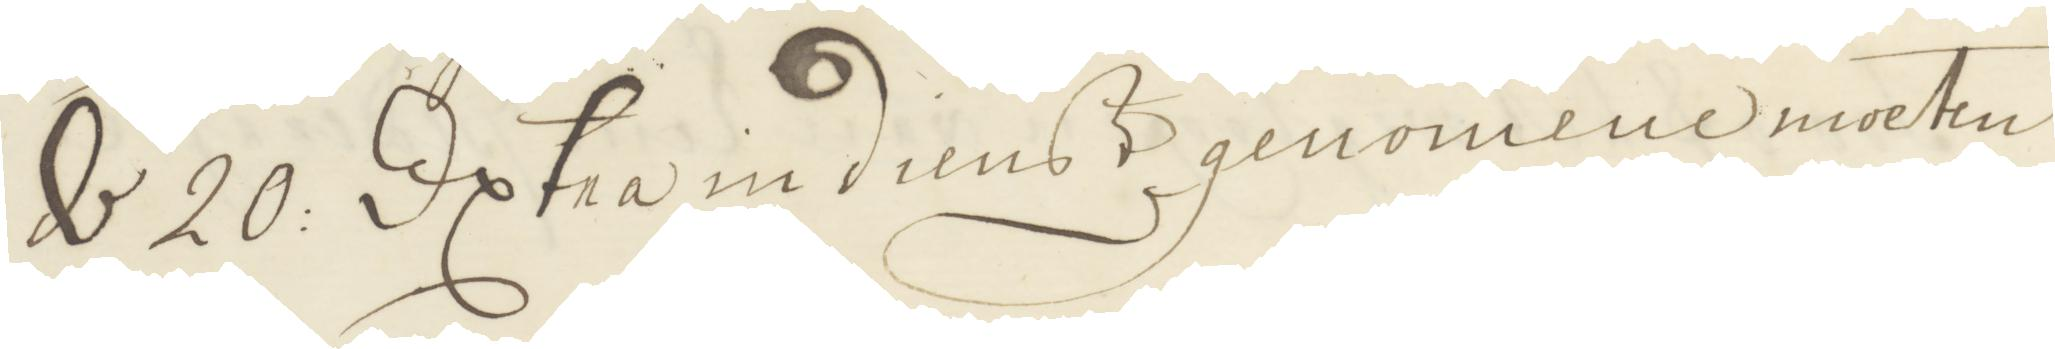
de 20: Extra in dienst genomene moetin
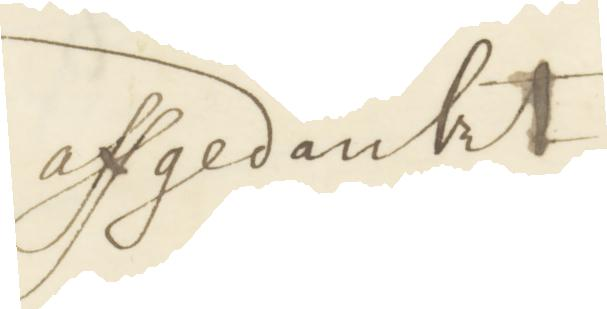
affgedankt
